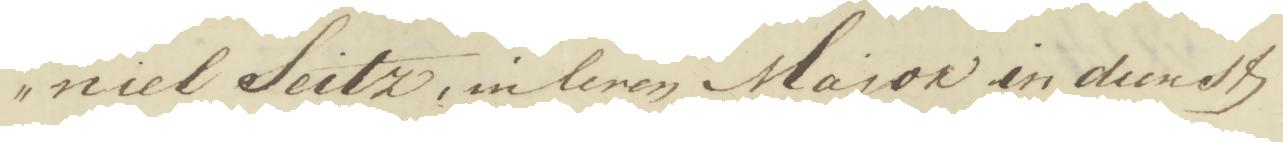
„niel Seitz, in leven Major in dienst
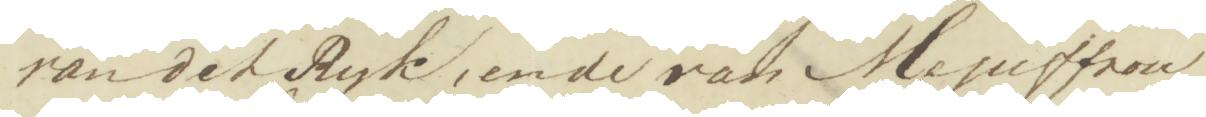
van dit Ryk, ende van Mejuffrou
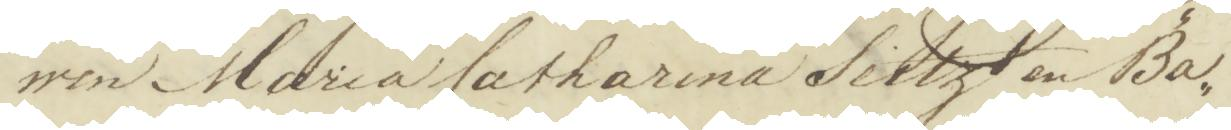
wen Maria Catharina Seitz en Ba„
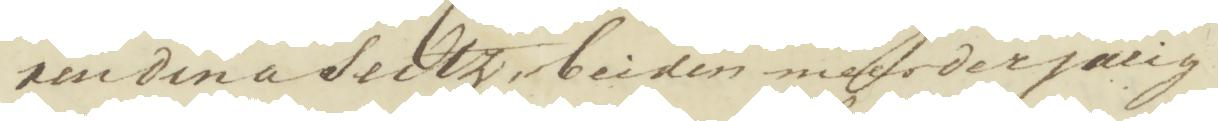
rendina Seitz, beiden meerderjarig
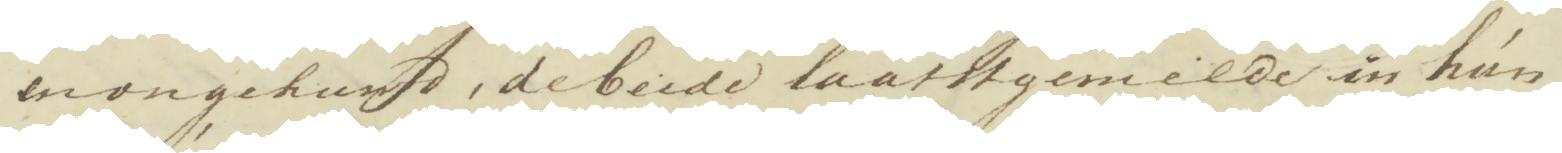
en ongehuwd, de beide laatstgemelde in hun
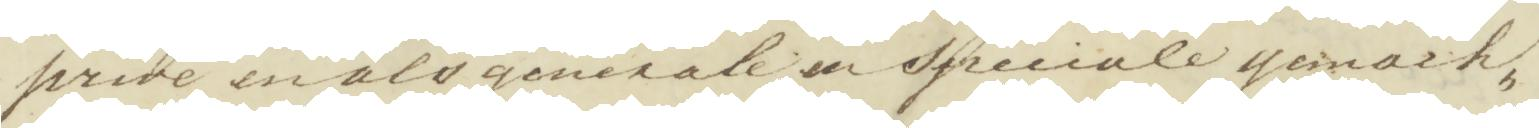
privé en als generale en speciale gemach„
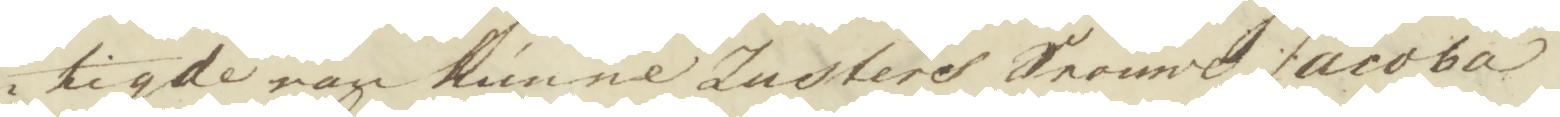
„tigde van hunne Zusters Vrouwe Jacoba
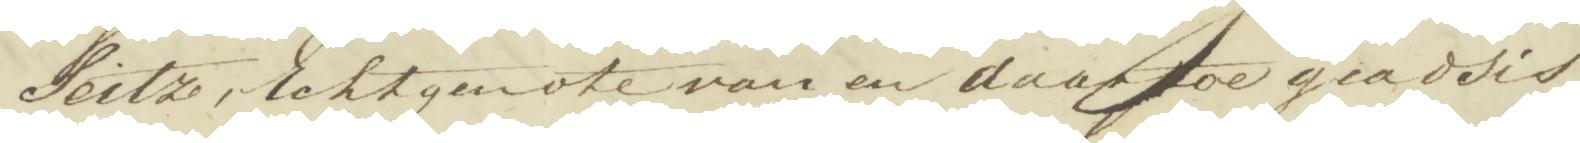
Seitz, Echtgenote van en daartoe geadsis
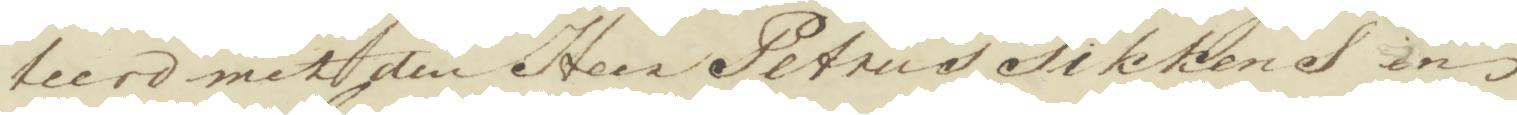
teerd met den Heer Petrus Sikkens en,
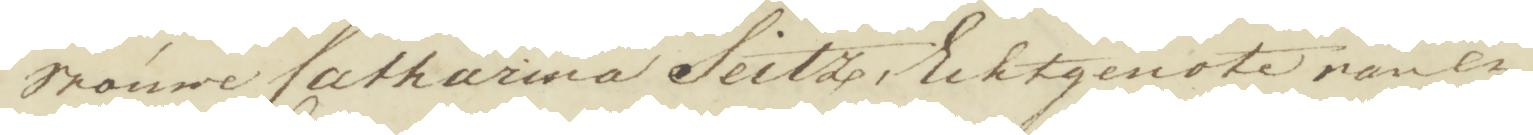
vrouwe Catharina Seitz, Echtgenote van en
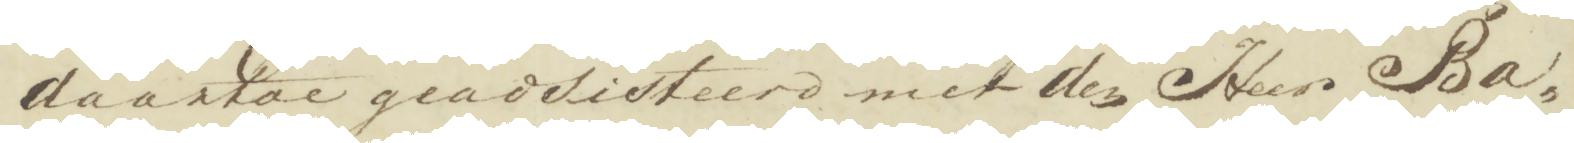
daartoe geadsisteerd met den Heer Ba„
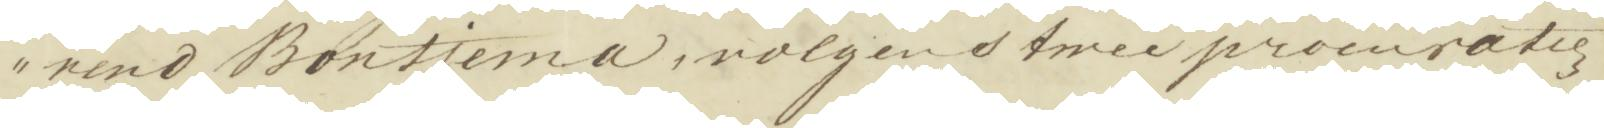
„rend Bontjema, volgens twee procuratien,
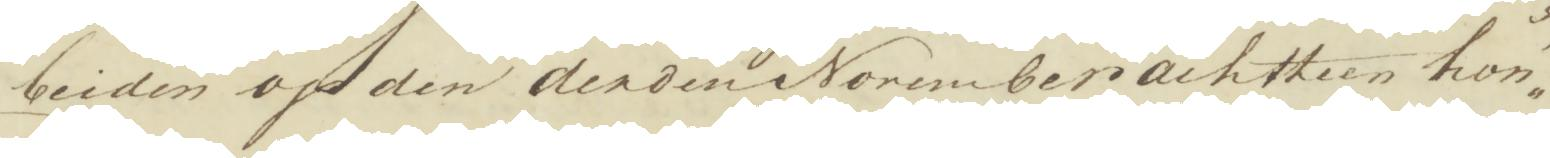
beiden op den derden November achttien hon„
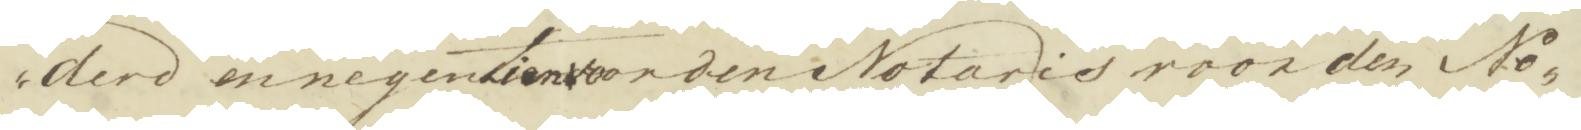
„derd en negentien voor den Notaris voor den No„
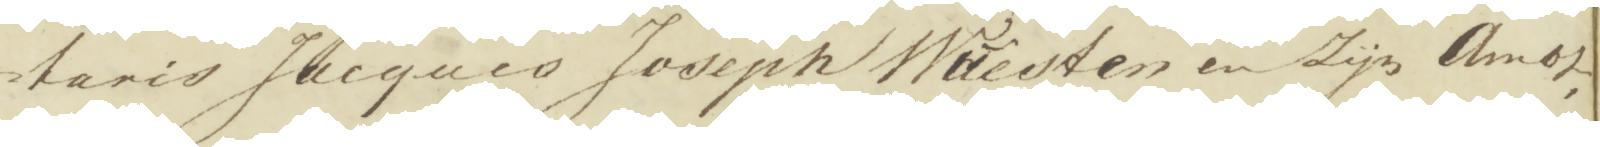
taris Jacques Joseph Wuesten en zijn Ambt,
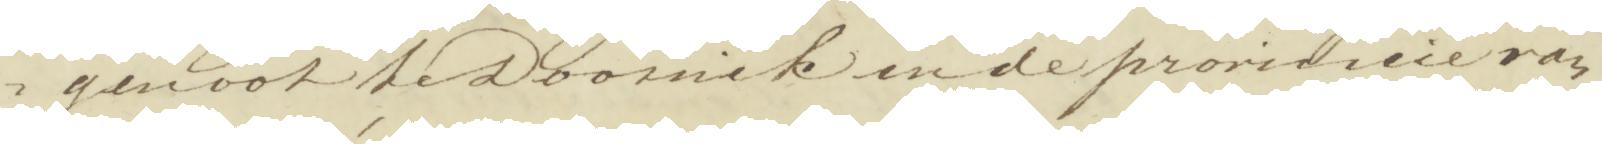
„genoot te Doornik in de provincie van
